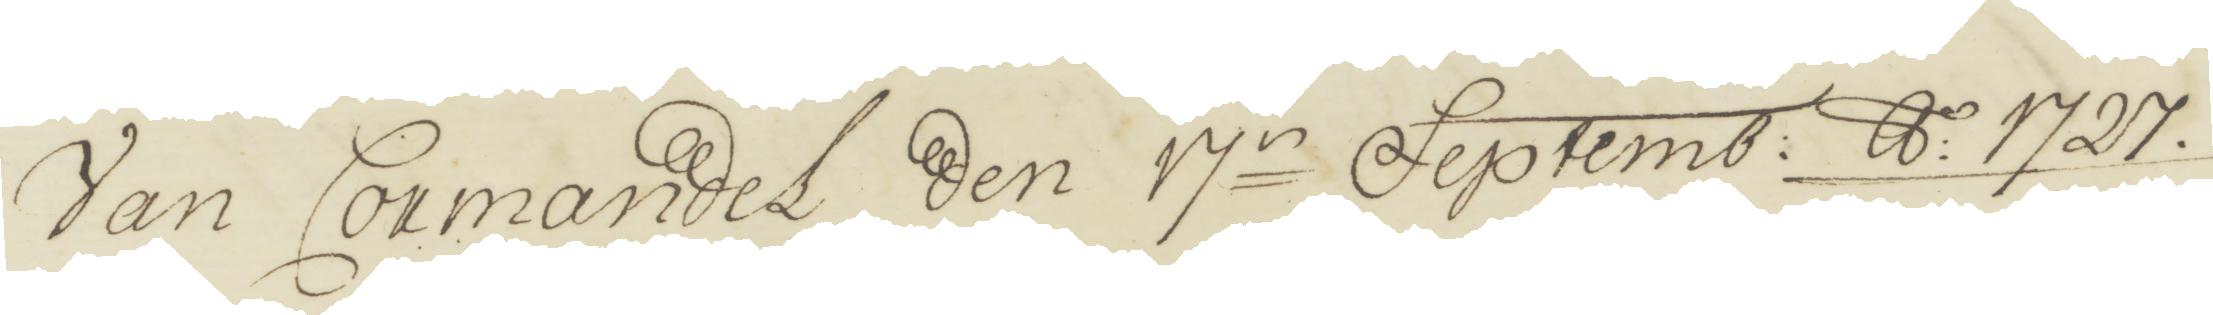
Van Cormandel den 17=n Septemb: A:o 1727.
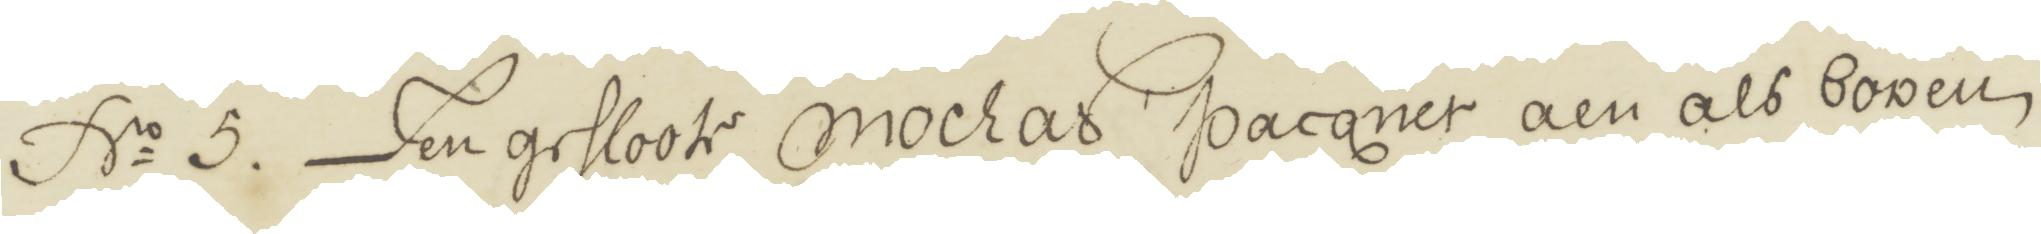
N=o 5. Een gesloot mochas pacquet aen als boven
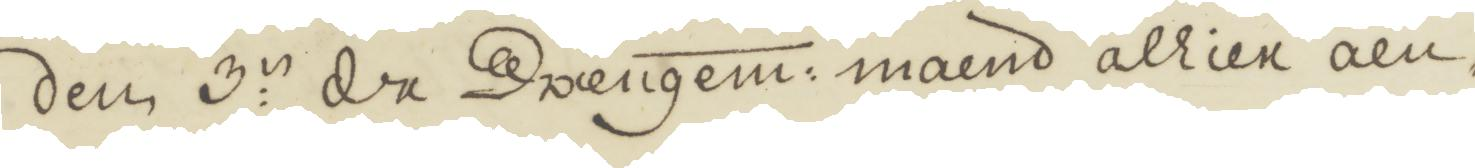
den 3:e der Evengem: maend alhier aen„
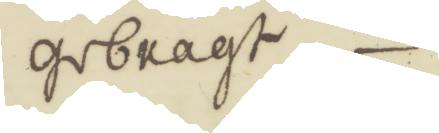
gebragt.—
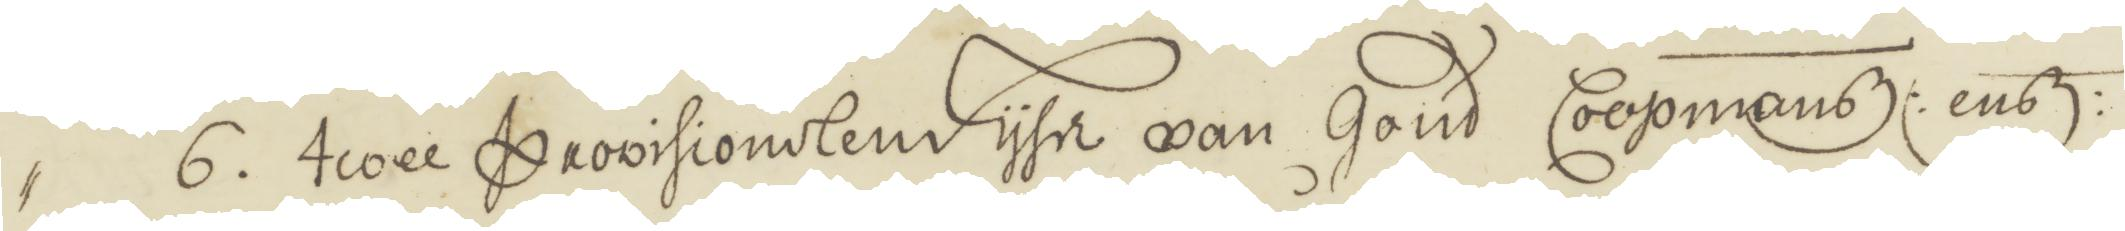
„ 6. twee provisionelen Eijsch van goud Coopmansz: ensz:
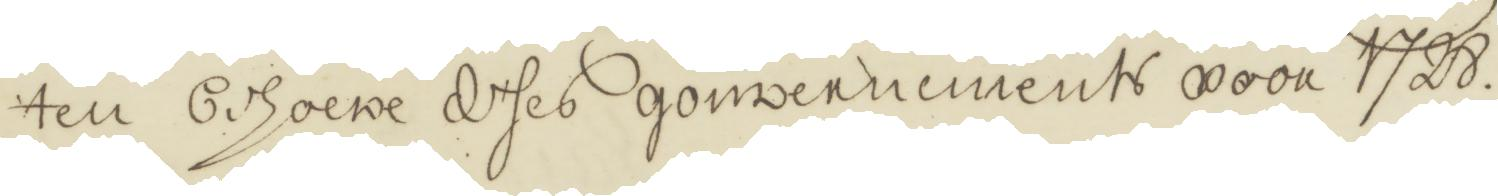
ten behoeve deses gouvernements voor 1728.
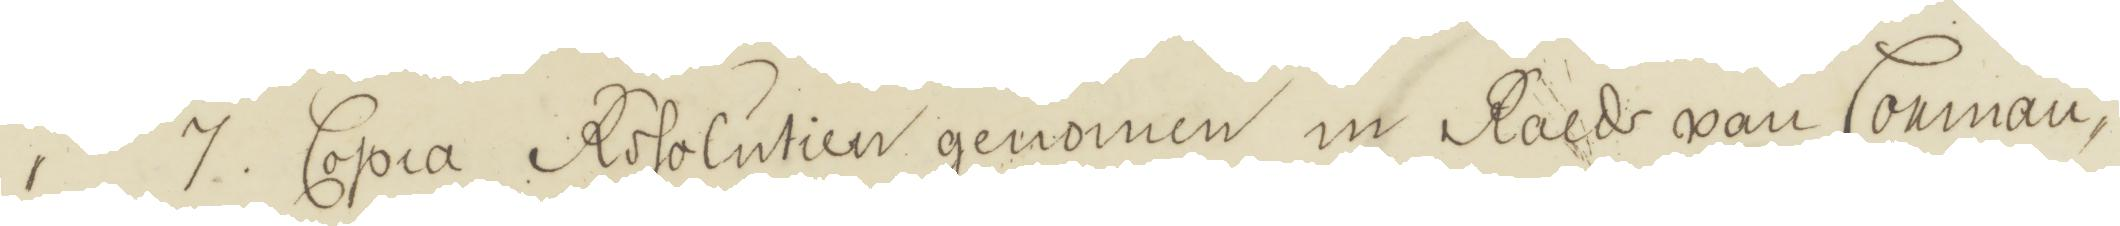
„ 7. Copia Resolutien genomen in Raede van Corman,
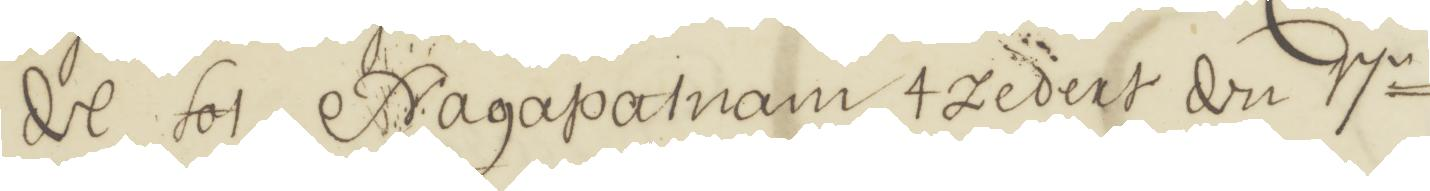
del tot Nagapatnam t zedert den 17=n
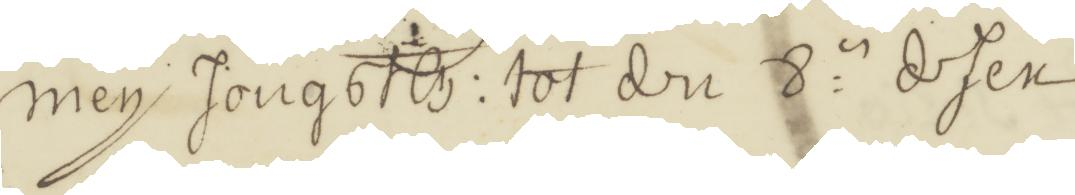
mey Jongstln tot den 8:e deser
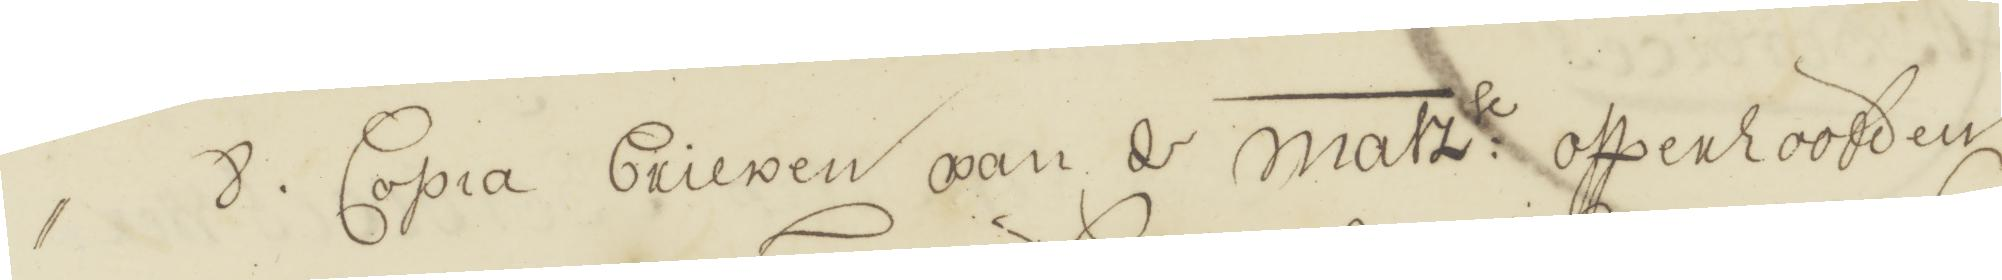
„ 8. Copia brieven van de matz:k opperhoofden
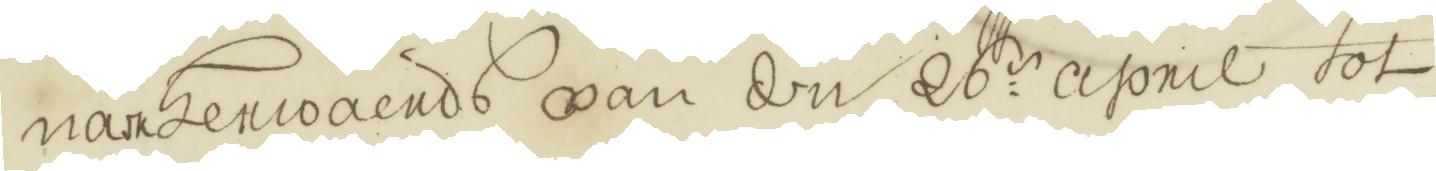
naer herwaerds van den 26:e april tot
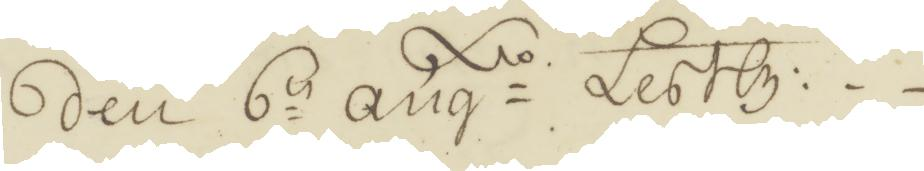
den 6:e aug=to Lestln: -
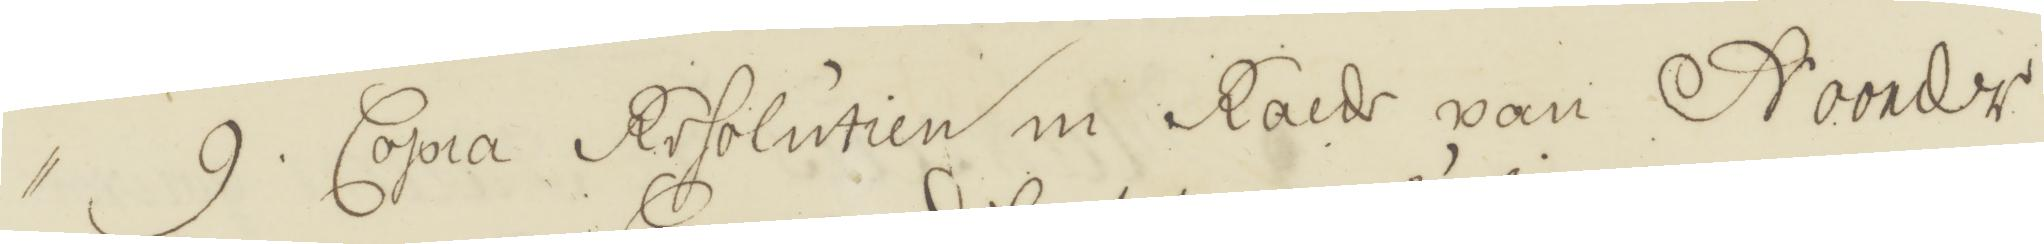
„ 9. Copia Resolutien in Raede van Noorder
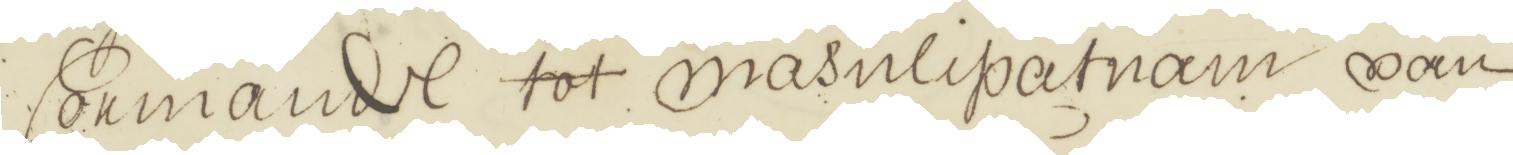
Cormandel tot masulipatnam van
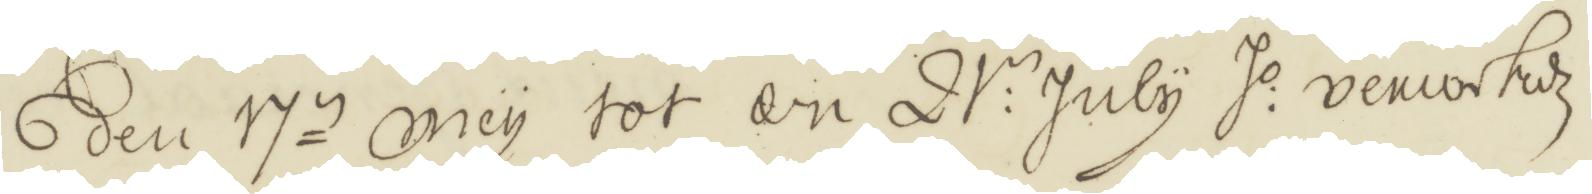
den 17=e meij tot den 21:e Julij J:o verweken
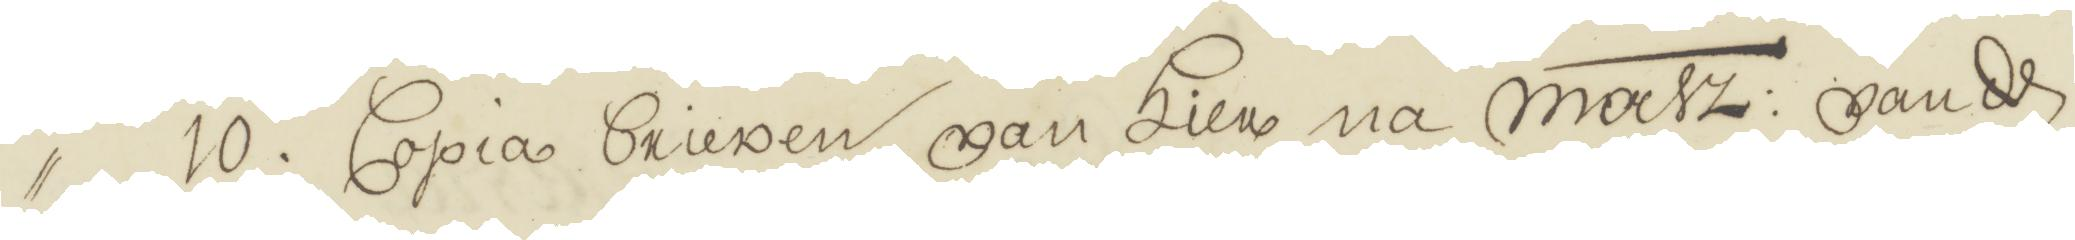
„ 10. Copia brieven van hier na masz: van den
